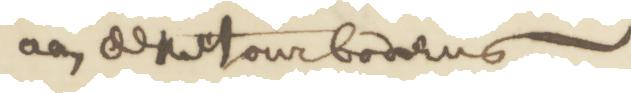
aan de retourbodems,.
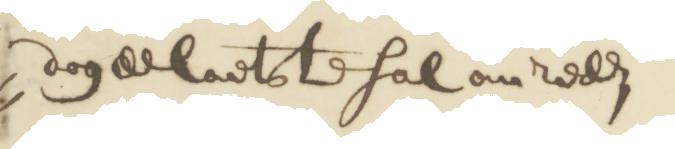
dog de laetste sal om reden
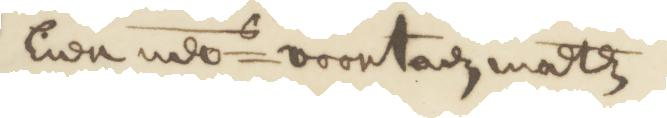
hier nev=s voortaen maten
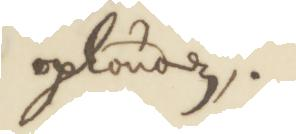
ophouden.
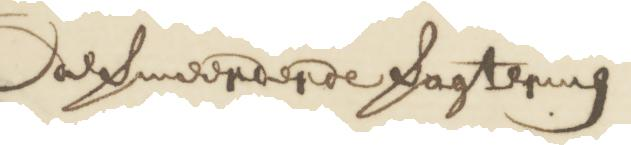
de vermeerderde veragtering
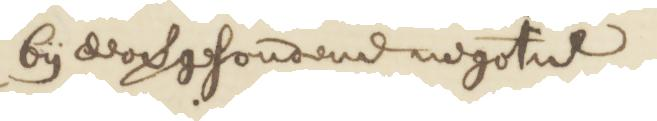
bij de overgesondene negotie
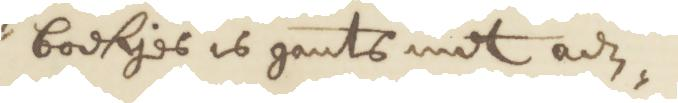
boekjes is gants niet aen„
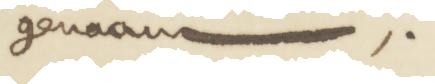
genaam,.
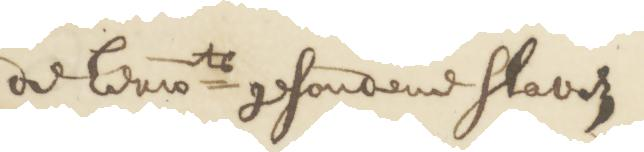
de her:te gesondene slaven
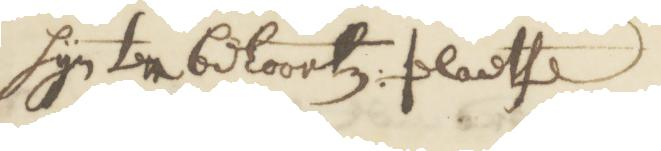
sijn ter behoorlijk: plaetse
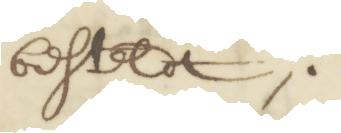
besteldt,.
